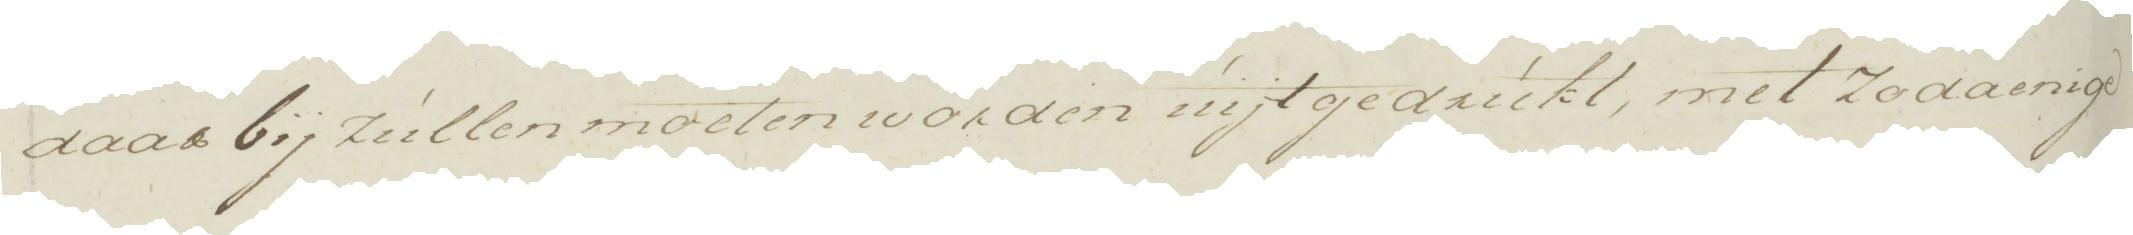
daar bij zullen moeten worden uijtgedrukt, met zodaenige
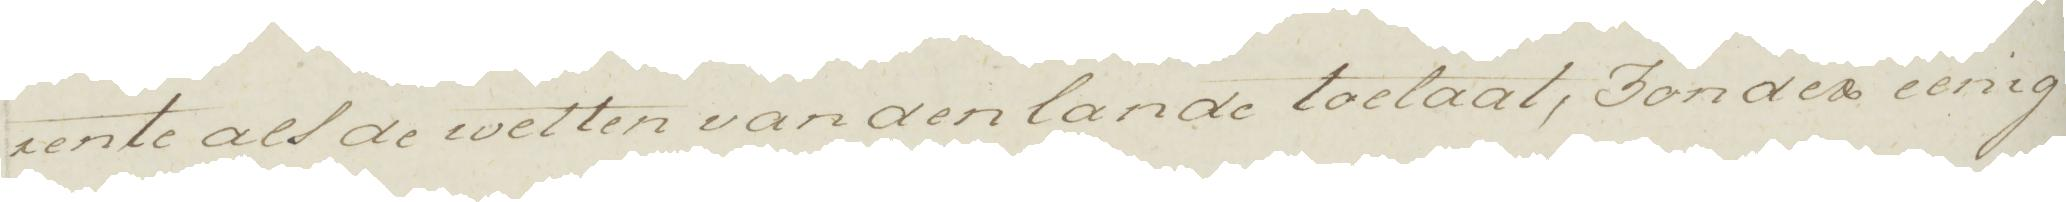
rente als de wetten van den lande toelaat, zonder eenig
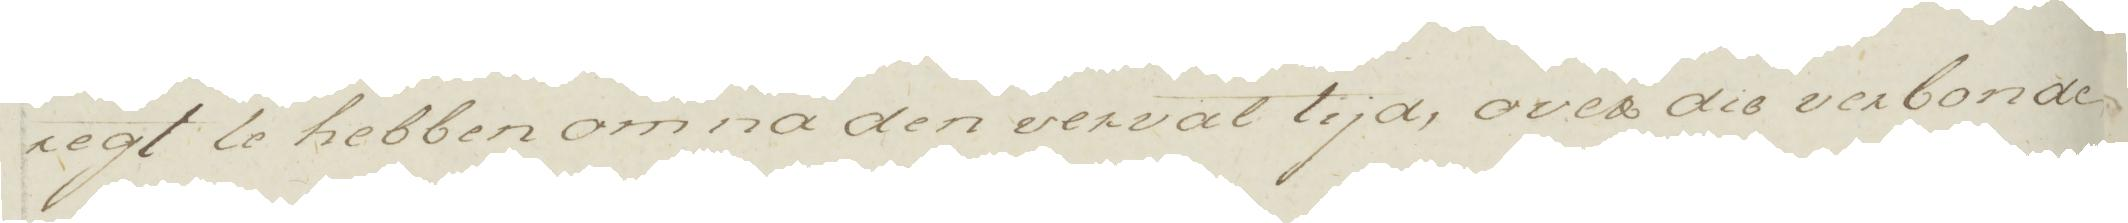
regt te hebben om na den verval tijd, over die verbonden
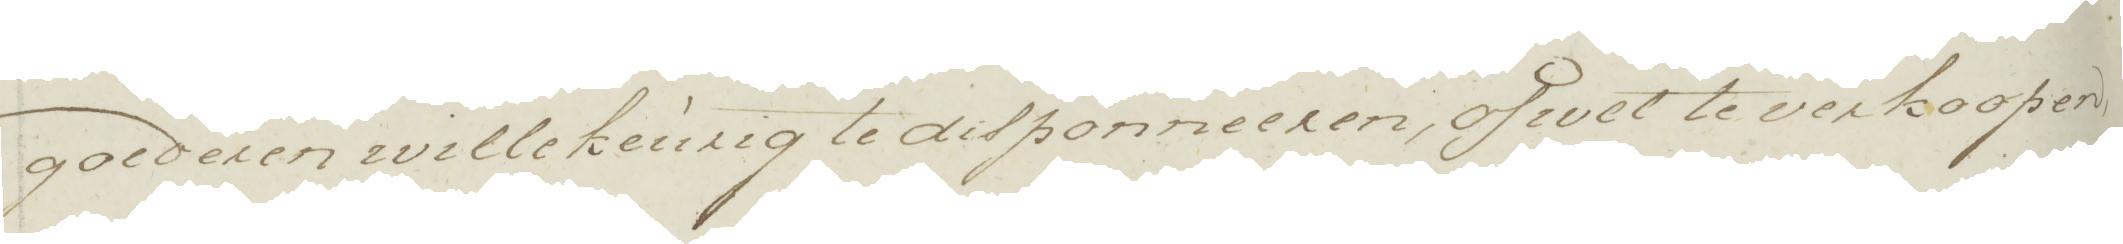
goederen willekeurig te disponneeren, of wel te verkoopen
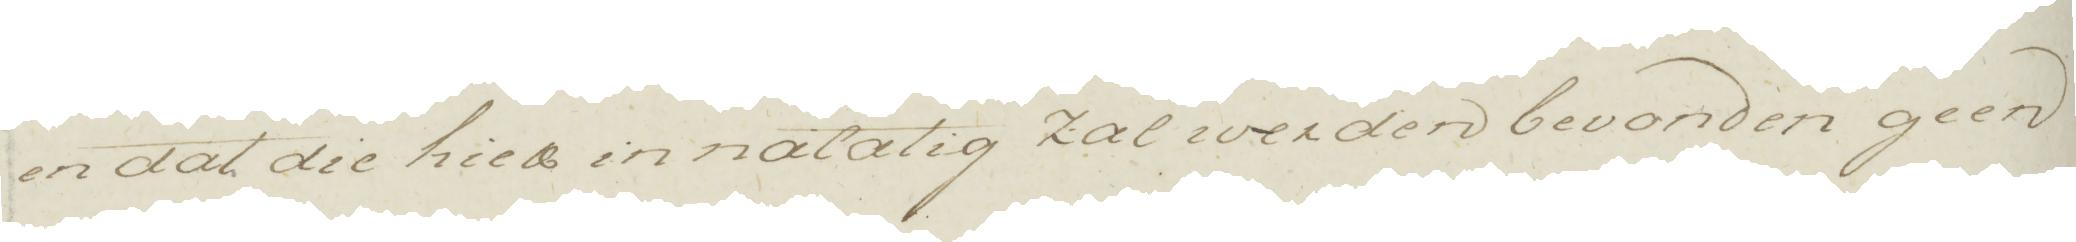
en dat die hier in nalatig zal werden bevonden geen
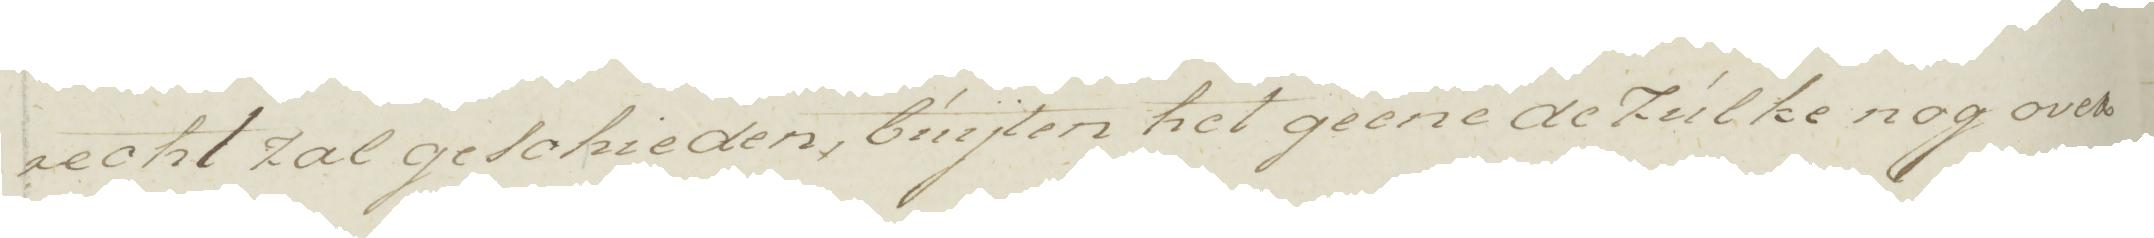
recht zal geschieden, buijten het geene de zulke nog over
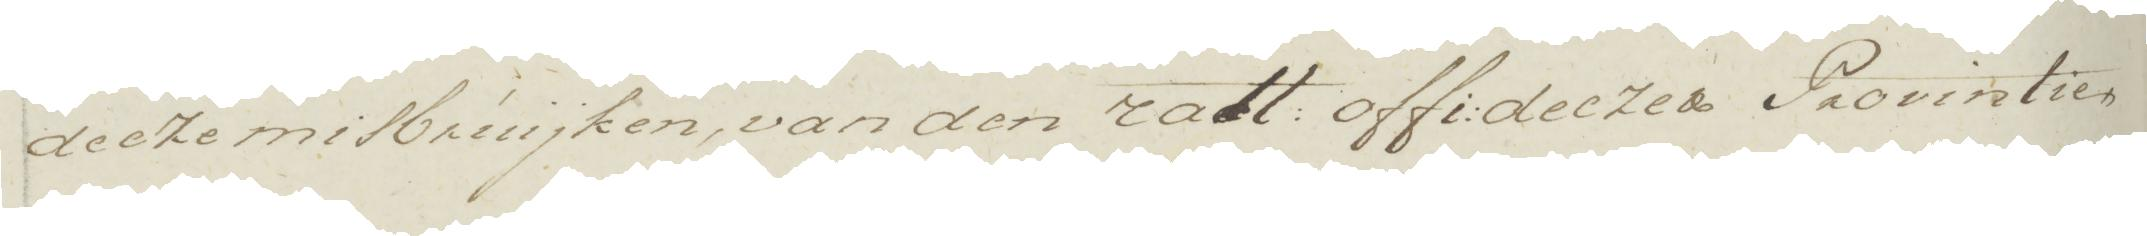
deeze misbruijken, van den ratt: offi: deezer Provintien
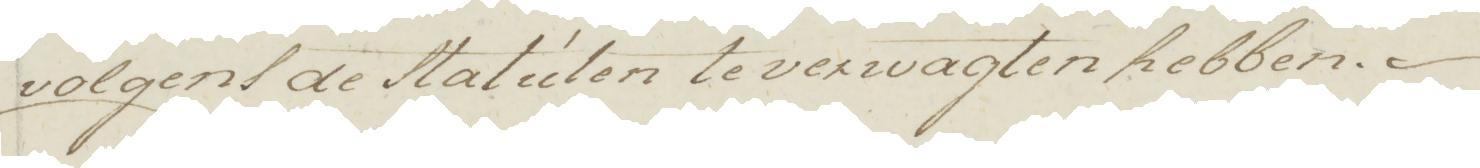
volgens de statuten te verwagten hebben. —
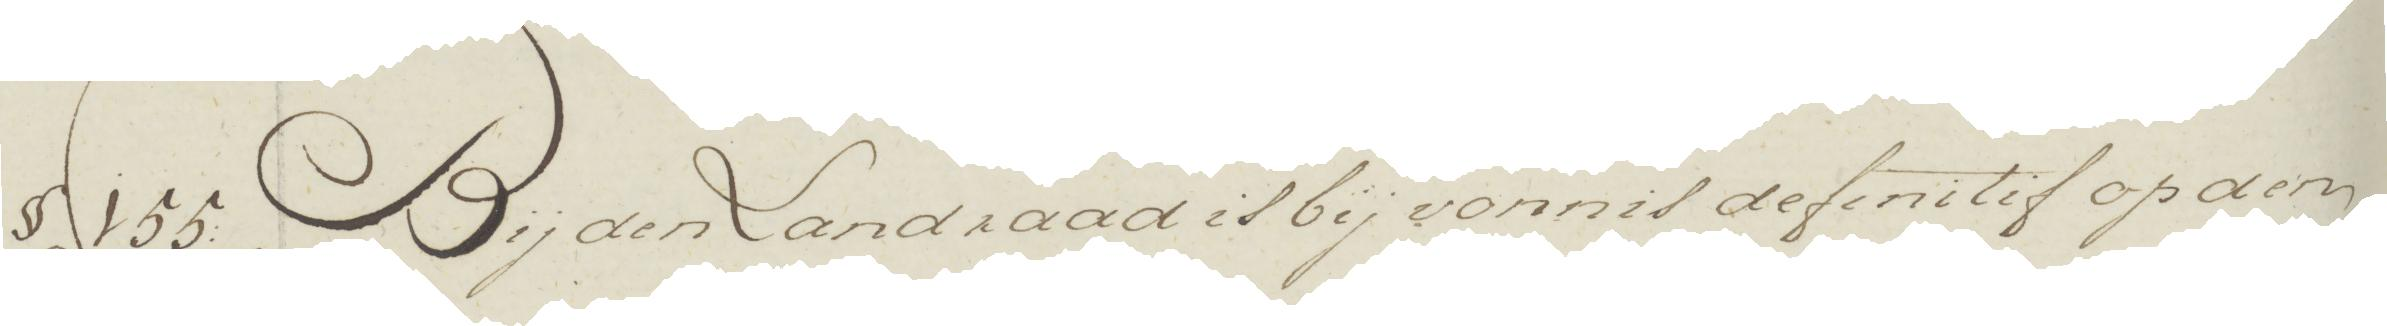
§ 155: Bij den Landraad is bij vonnis definitif op den
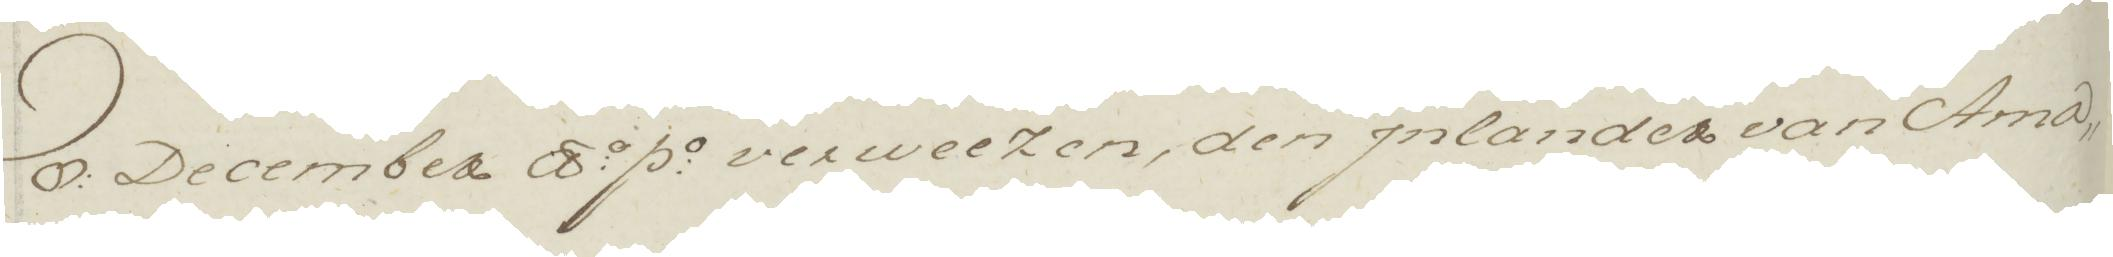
8: December a:o p:o verweezen, den jnlander van Ama„
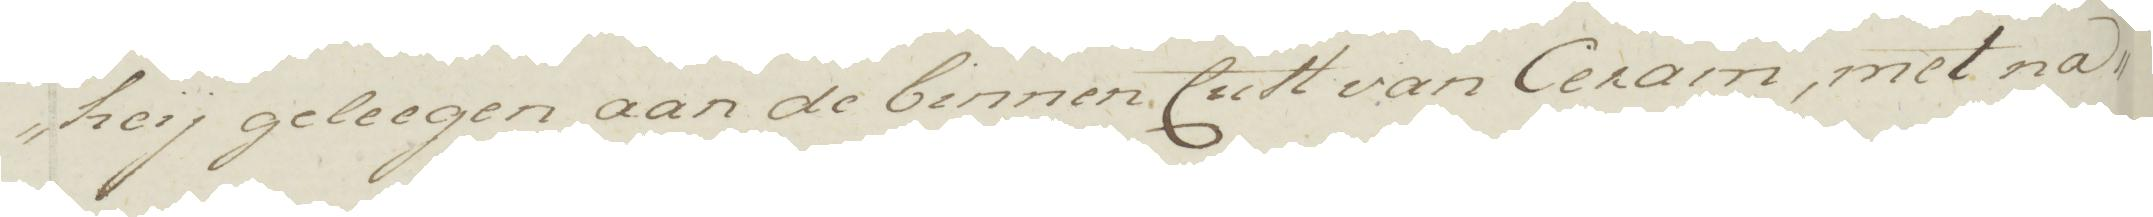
„heij geleegen aan de binnen cust van Ceram, met na„
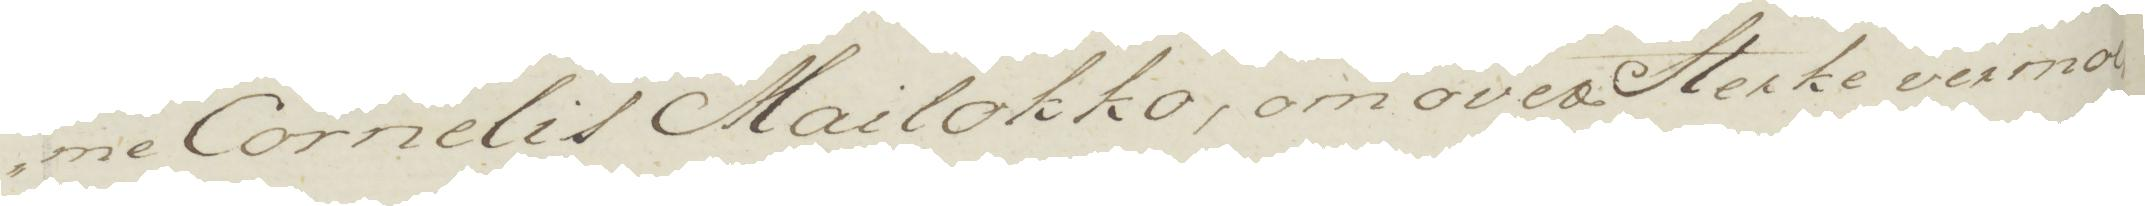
„me Cornelis Mailokko, om over Sterke vermo
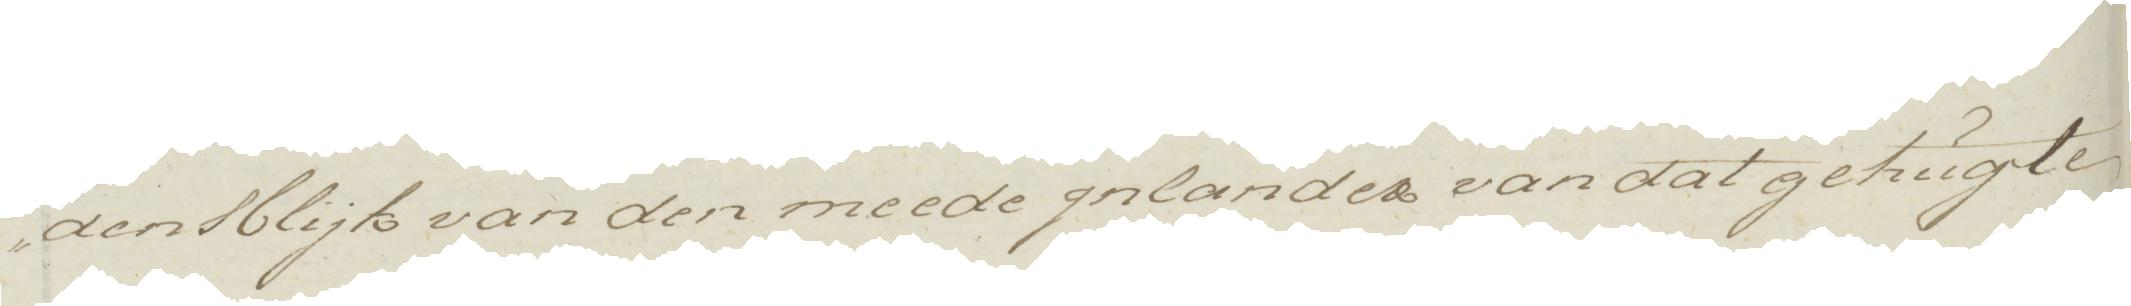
„dens blijk van den meede jnlander van dat gehugte
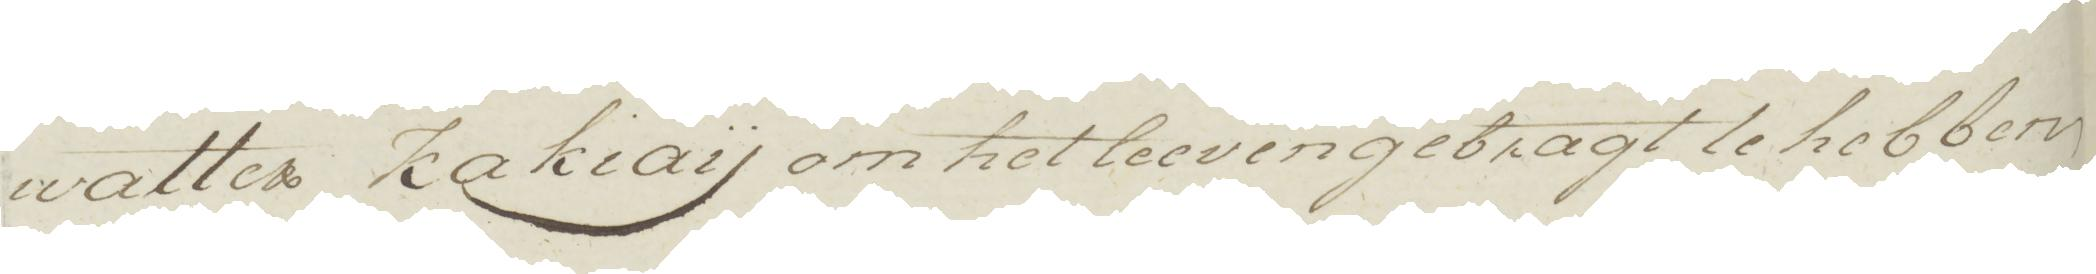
watter kakiaij om het leeven gebragt te hebben
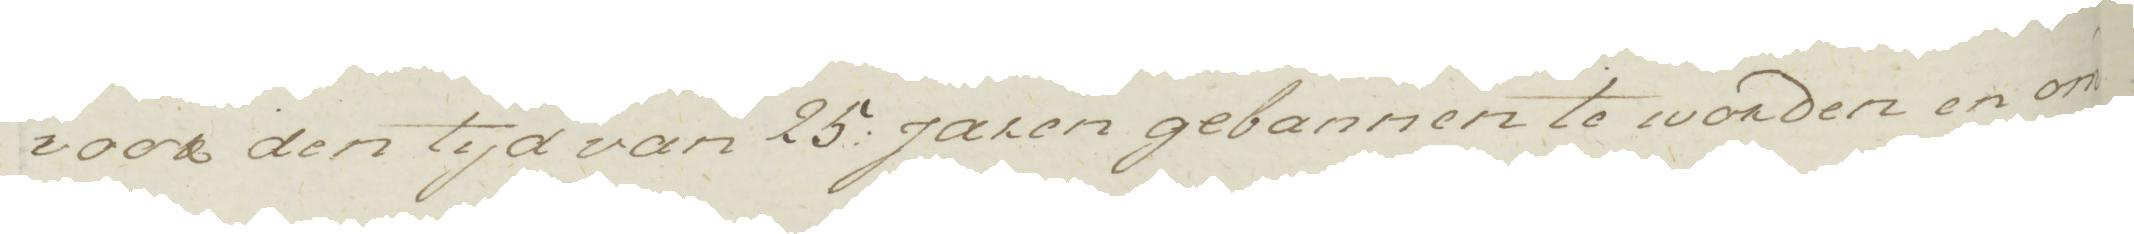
voor den tijd van 25: Jaren gebannen te worden en om
